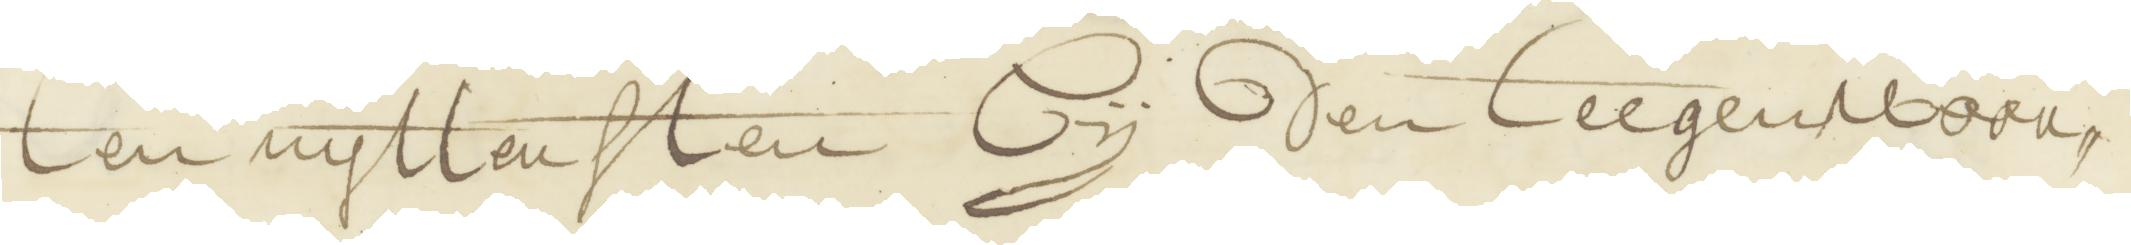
ten uijttersten bij den teegenwoor„
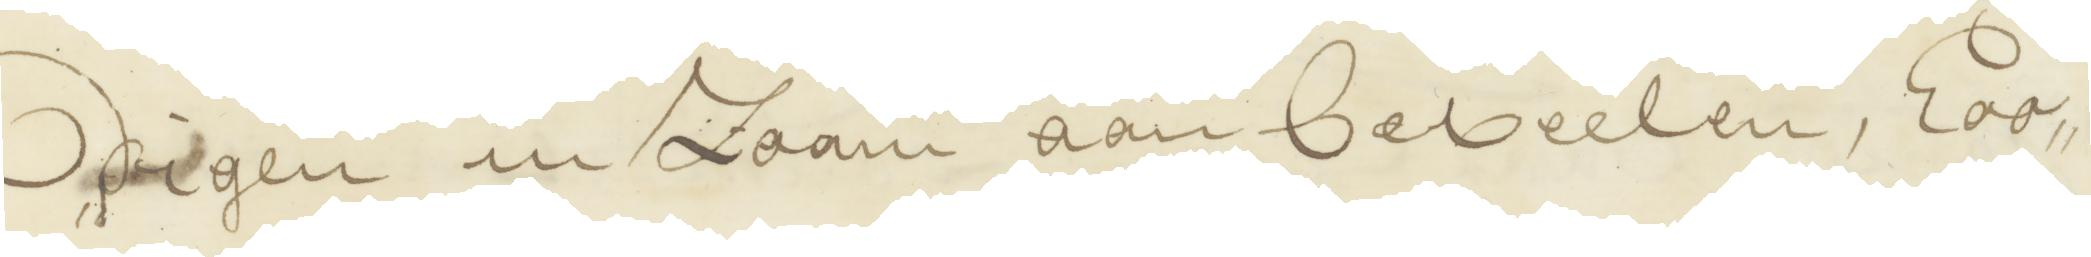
digen in zaam aan beveelen, hoo„
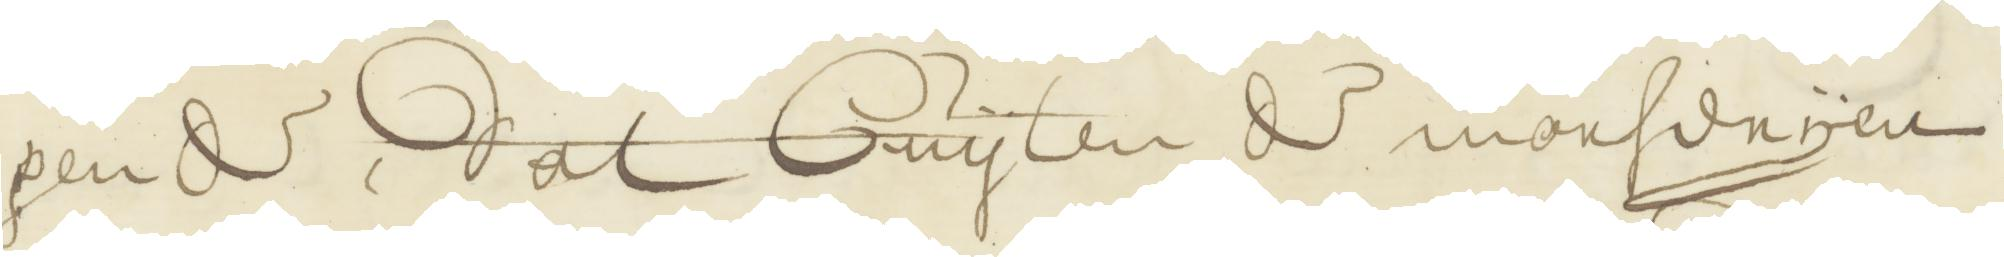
pende dat buijten de morserijen
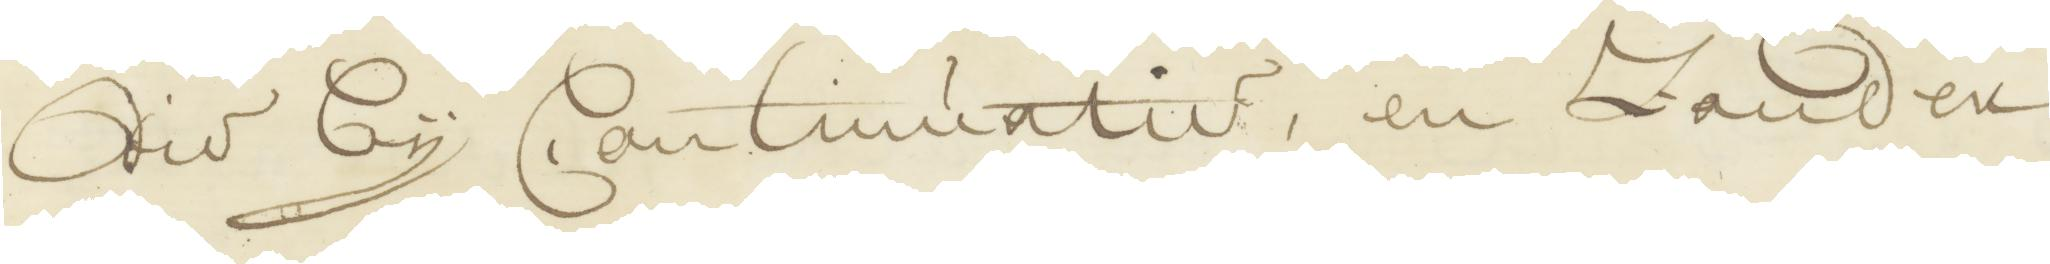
die bij Continuatie, en zonder
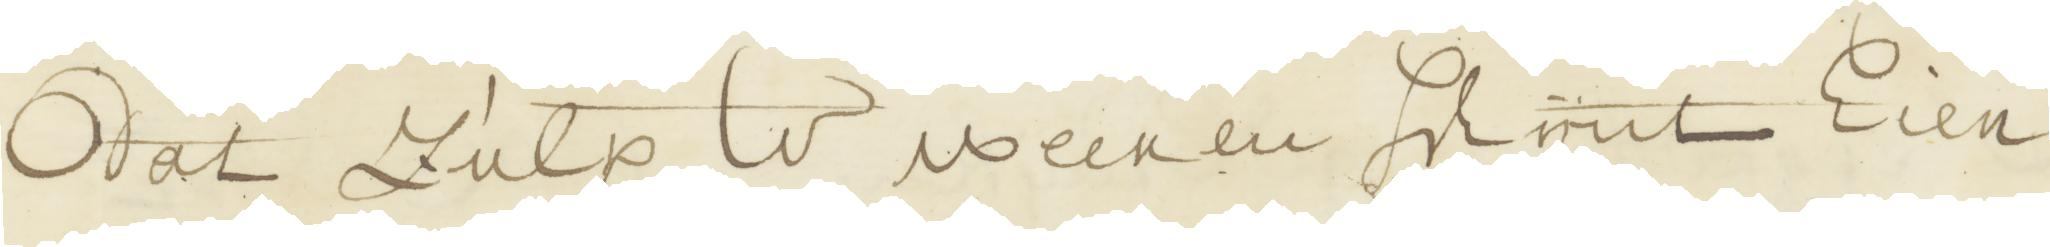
dat zulx te weeren schijnt hier
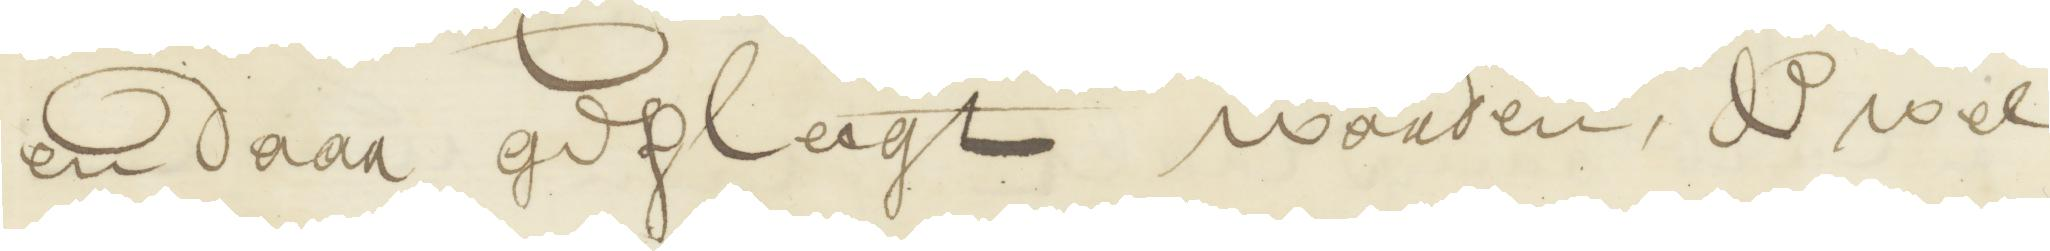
en daar gepleegt worden, de wel
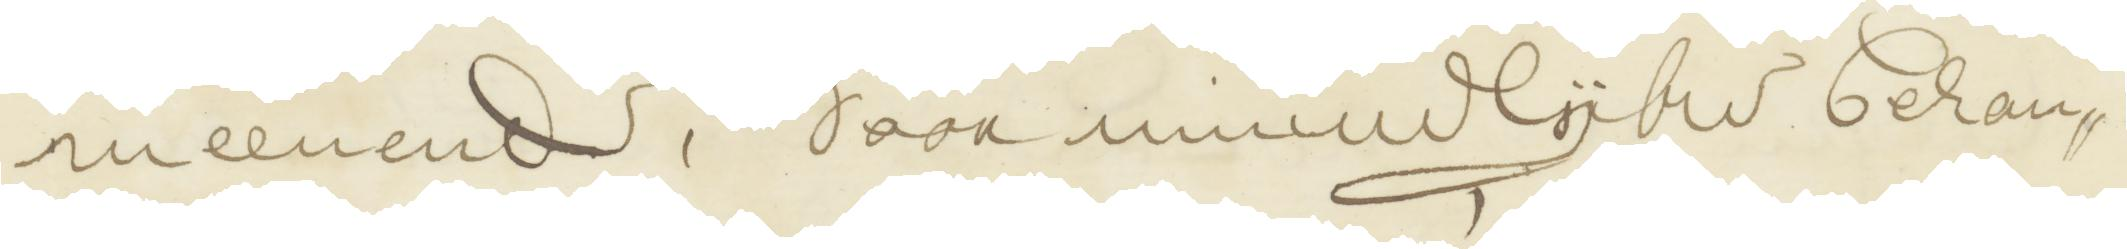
meenende, door minnelijke behan„
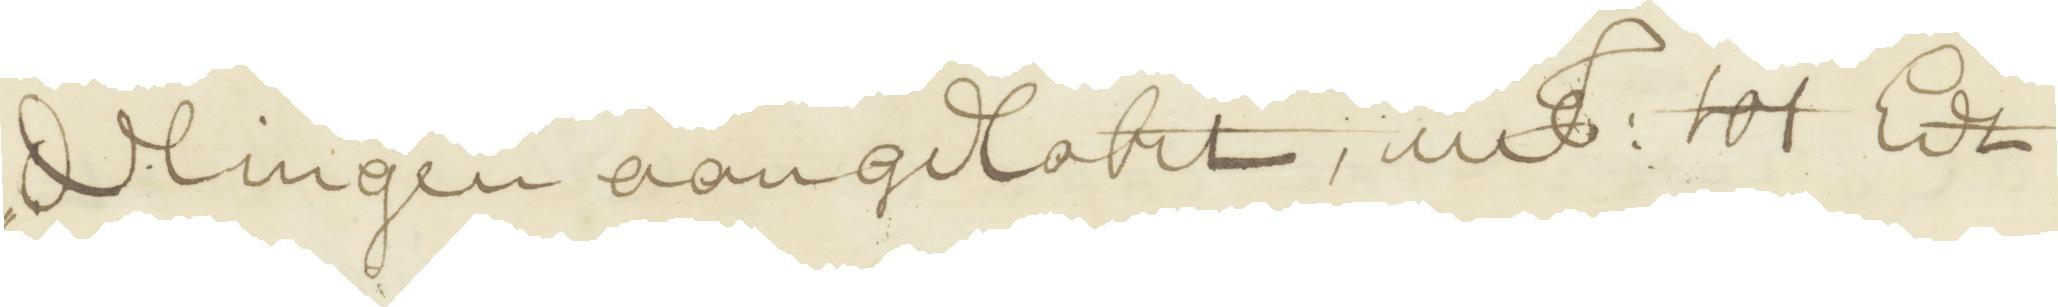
„delingen aangelokt; uE: tot het
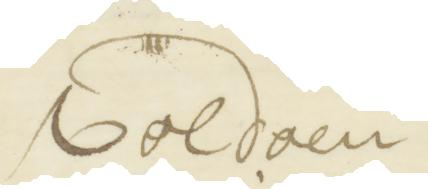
voldoen
